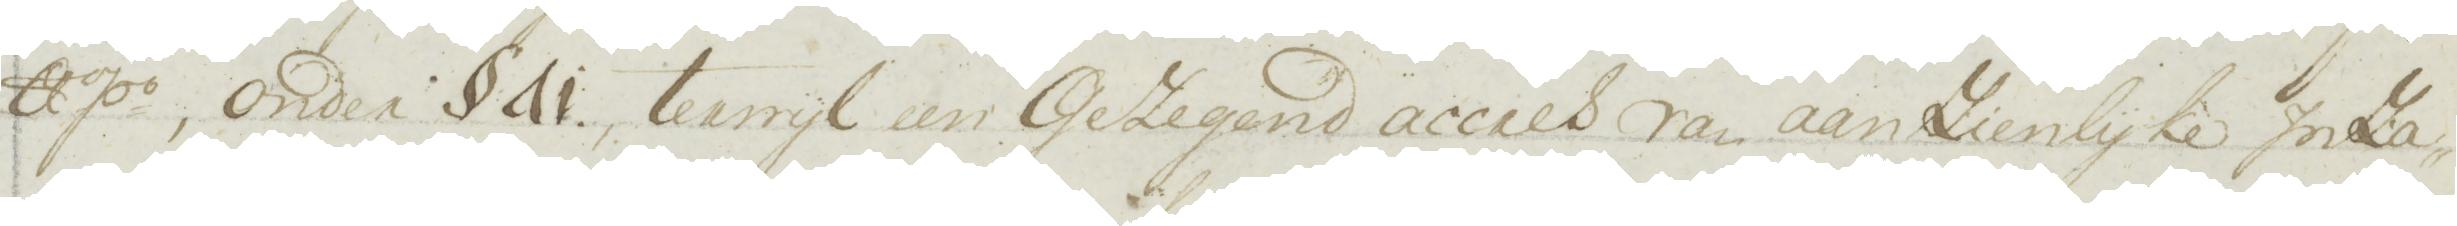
ao p=o, onder § 41., terwijl een Gezegend accres van aanzienlijke jnza„
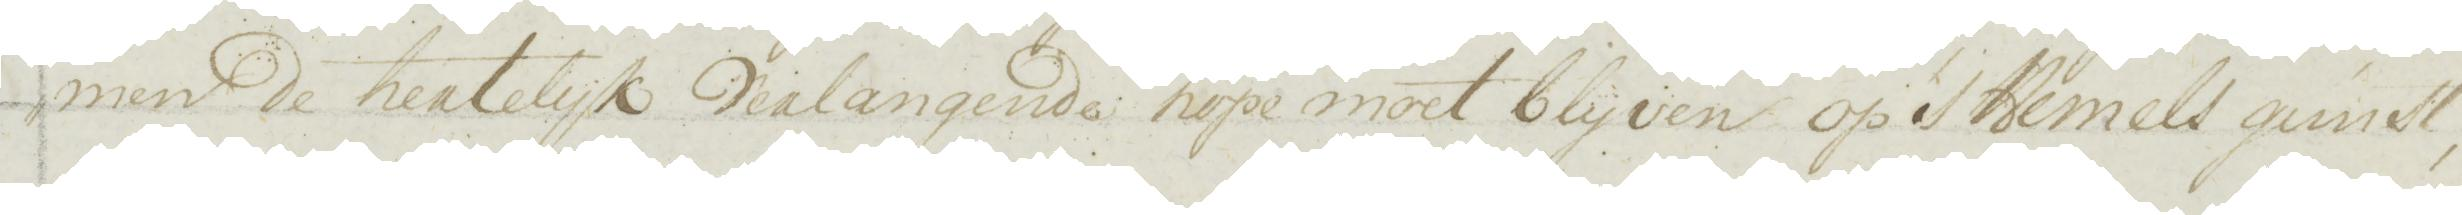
„men de hertelijk verlangende hope moet blijven op 's Hemels gunst,
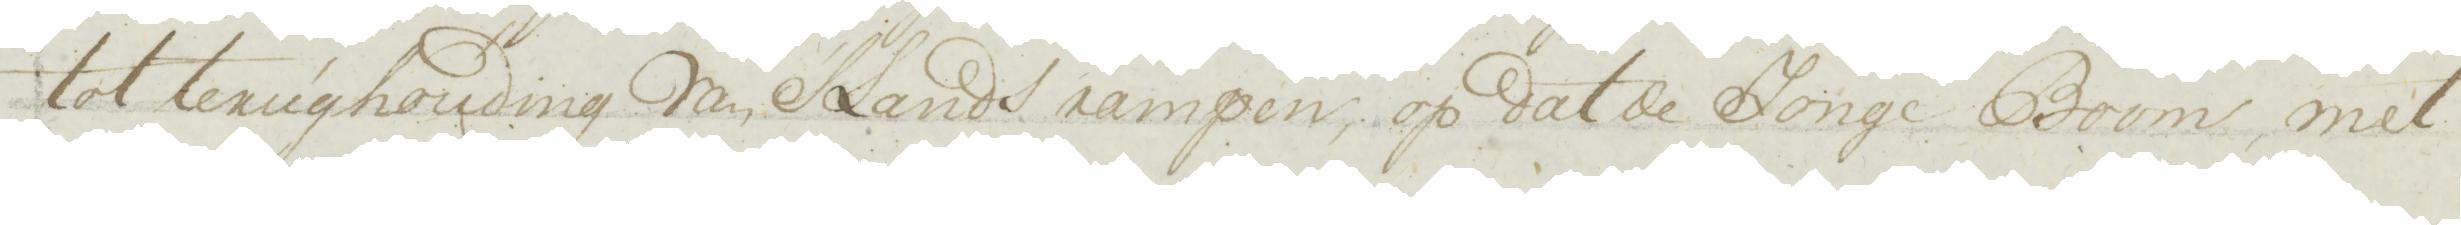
tot terughouding van 's Lands rampen, op dat de Ionge Boom met
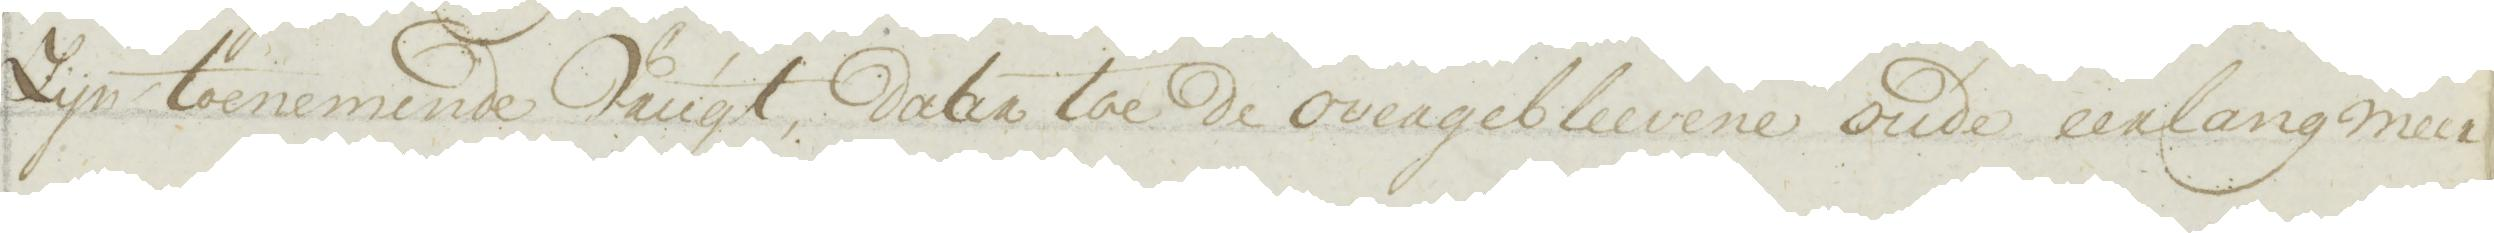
zijn toenemende Vrugt, daar toe de overgebleevene oude eerlang meer
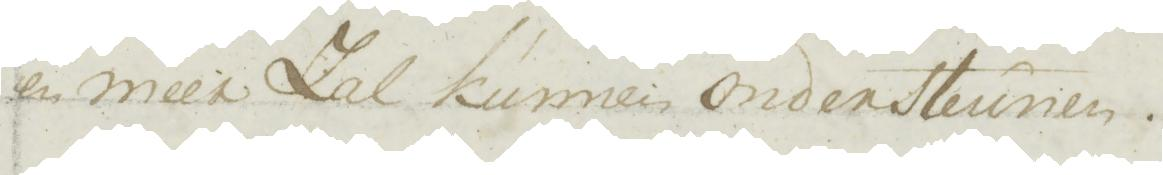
en meer zal kunnen ondersteunen.
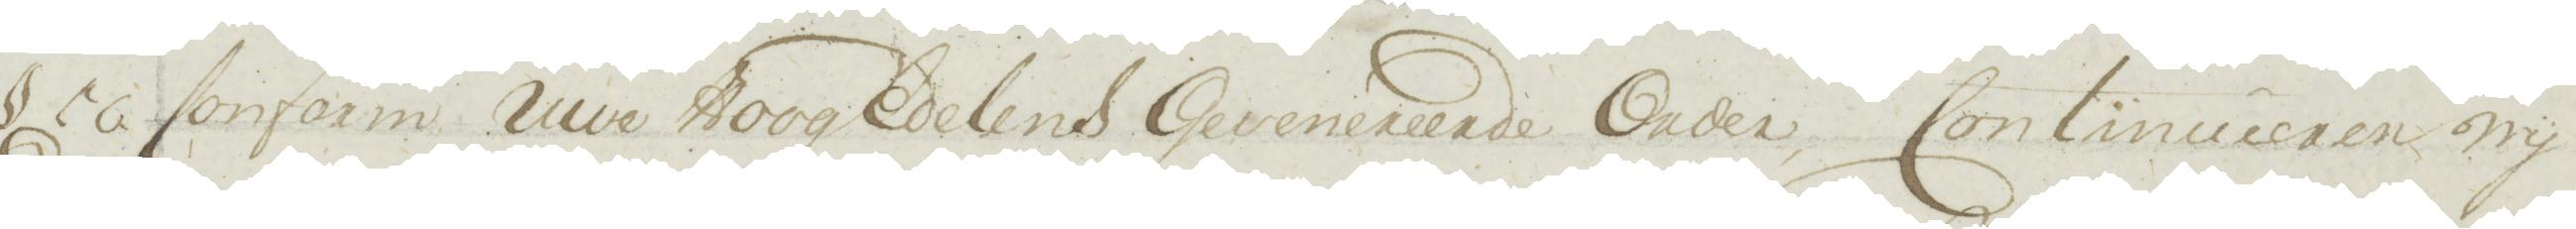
§ 50 Conform: uwe Hoog Edelens Gevenereerde Order, continueeren wij
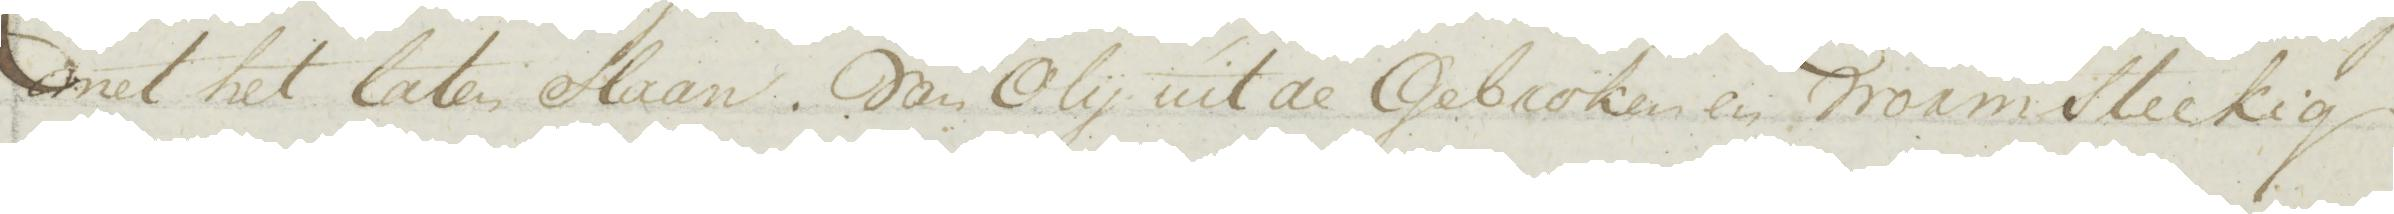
met het laten slaan. van Olij uit de Gebroken en wormsteekig
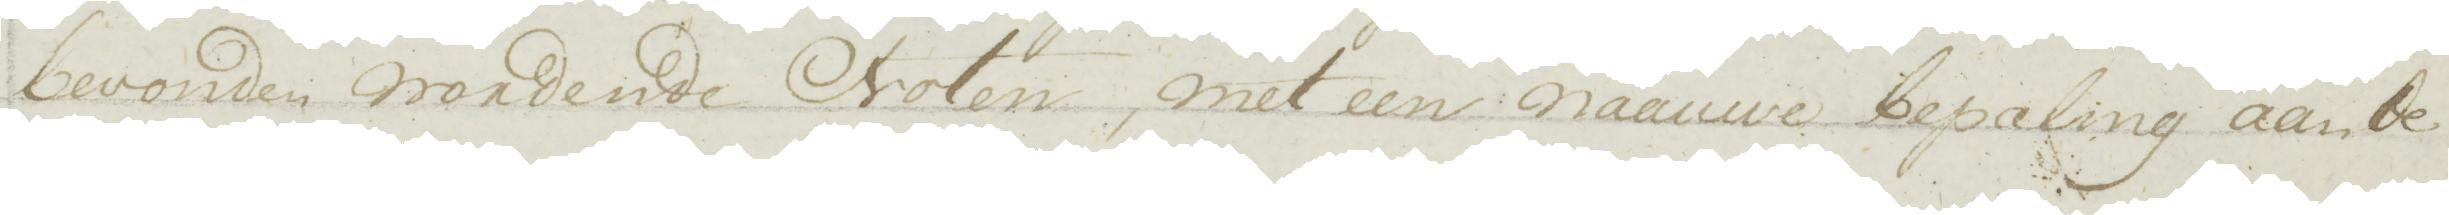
bevonden wordende Noten, met een naauwe bepaling aan te
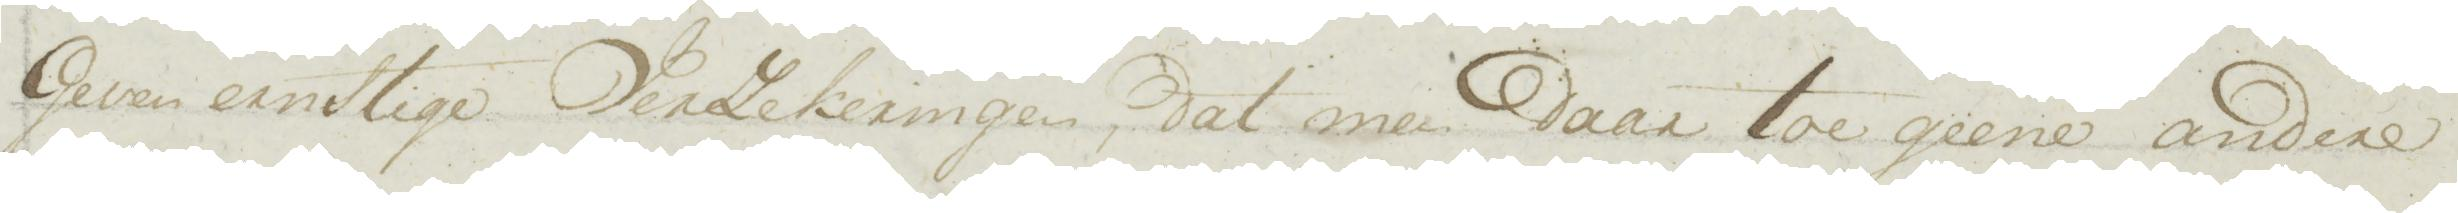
Geven ernstige Verzekeringen, dat men daar toe geene andere
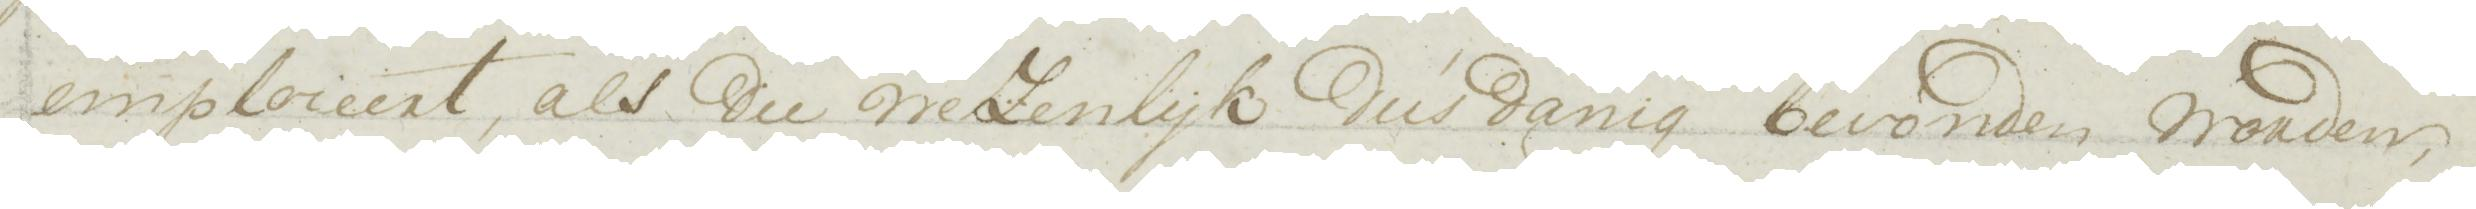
emploieert, als die wezenlijk dus danig bevonden worden,
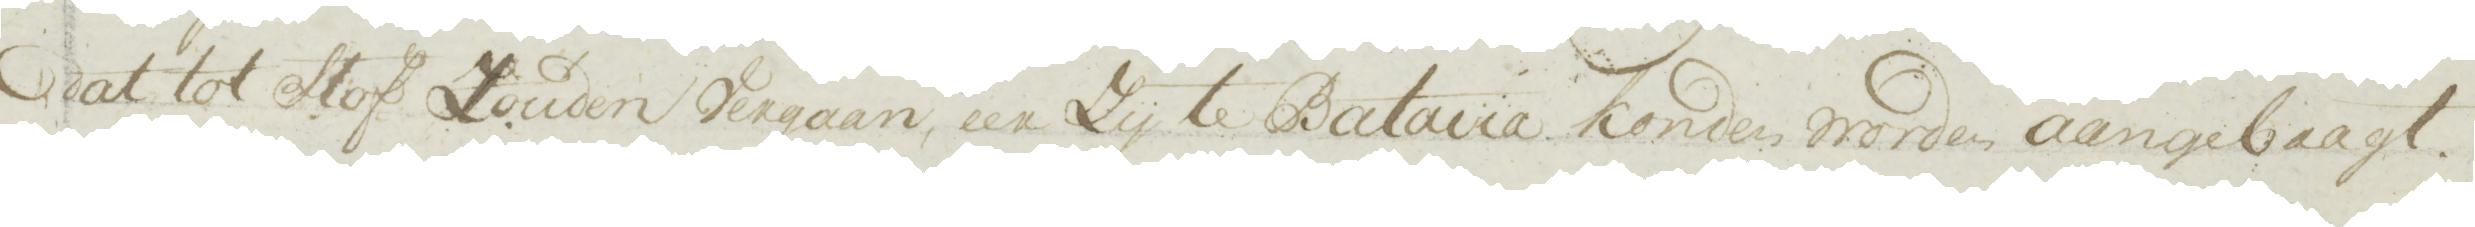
dat tot stof zouden vergaan, eer zij te Batavia konden worden aangebragt.
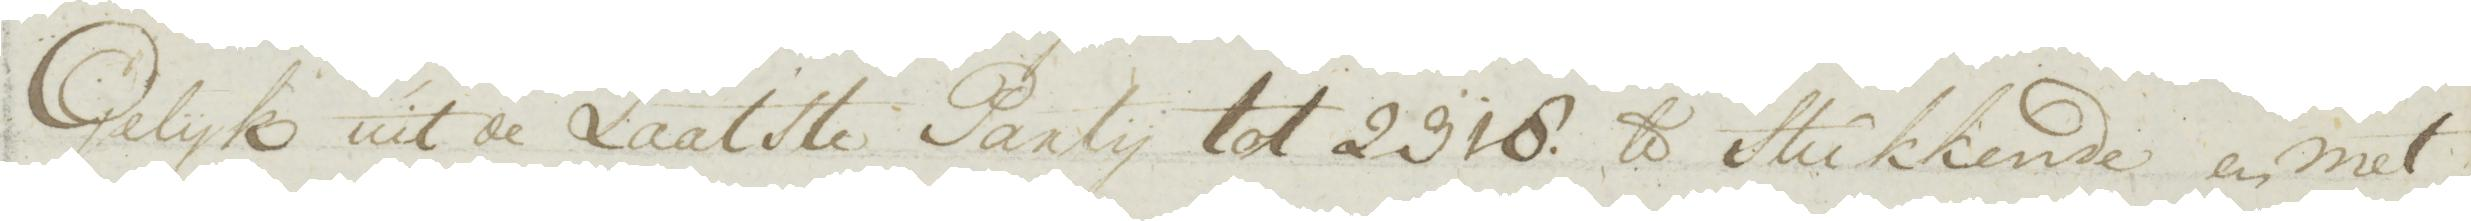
Gelijk uit de Laatste Partij tot 2318. lb stukkende en met
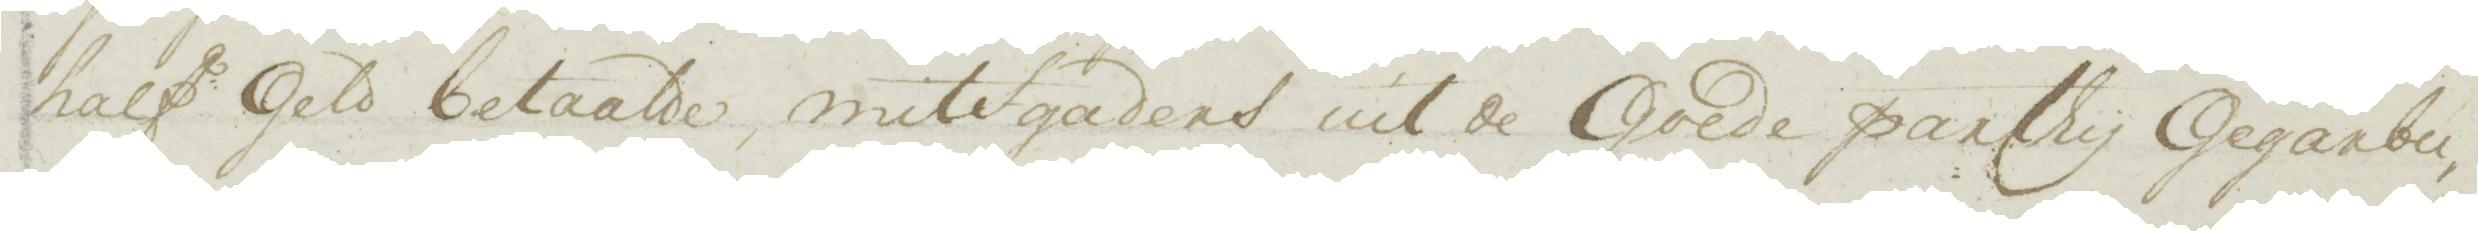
half geld betaalde, mitsgaders uit de Goede parthij Gegarbu„
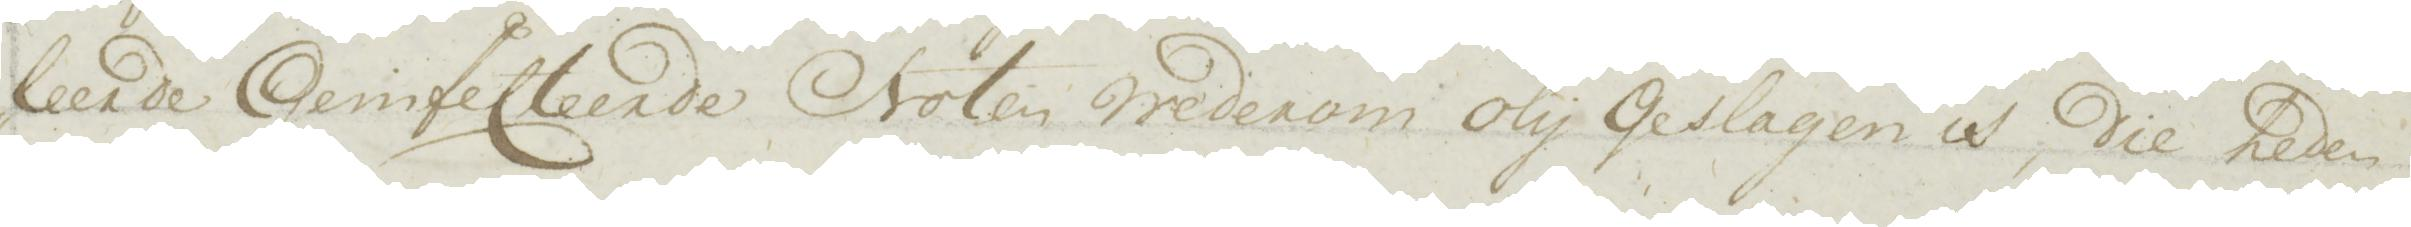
leerde Geinfecteerde Noten wederom olij geslagen is, die heden
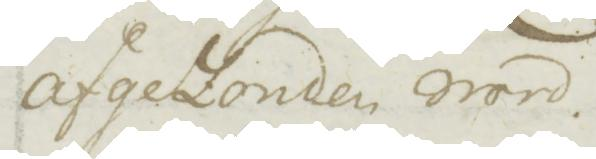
afgezonden word.
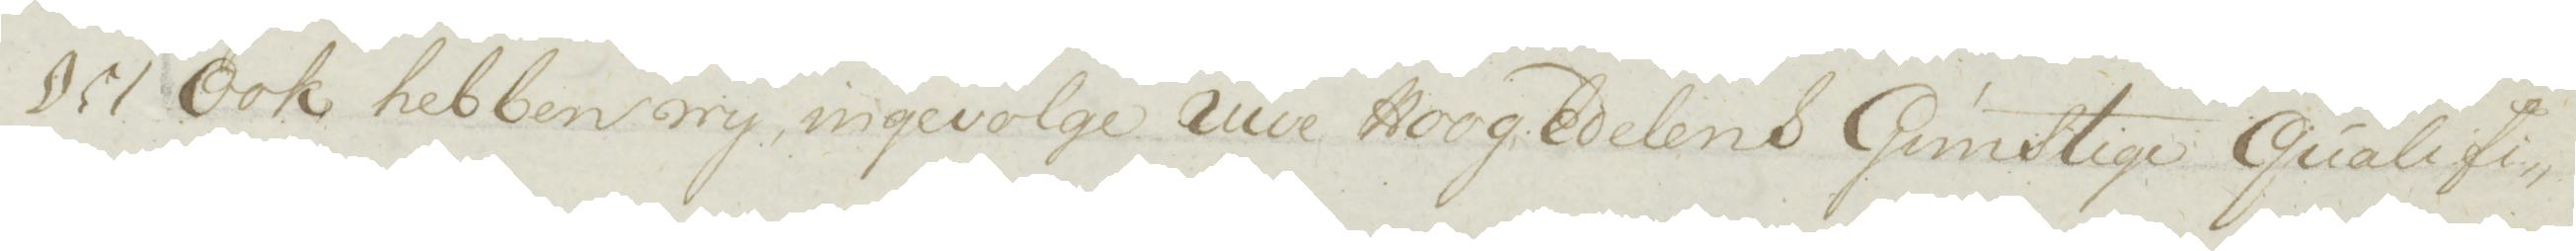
§ 51 Ook hebben wij, ingevolge uwe Hoog Edelens Gunstige Qualifi„
